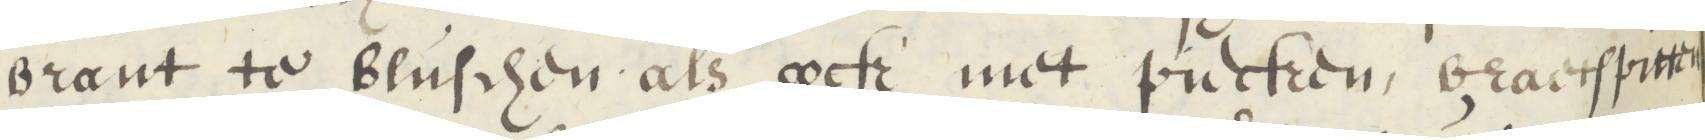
brant te bluschen als oock met piecken, braetspitten
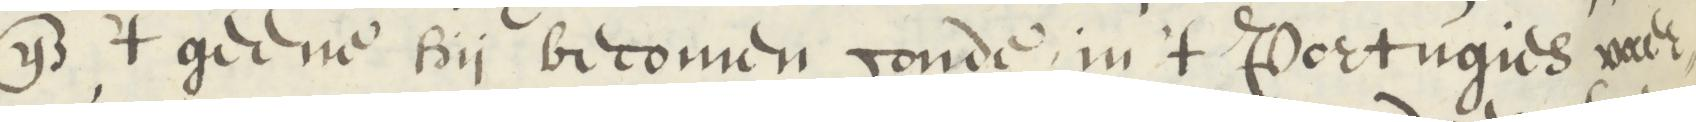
ende ’t geene hij becomen conde, in ’t Portugies vaer„
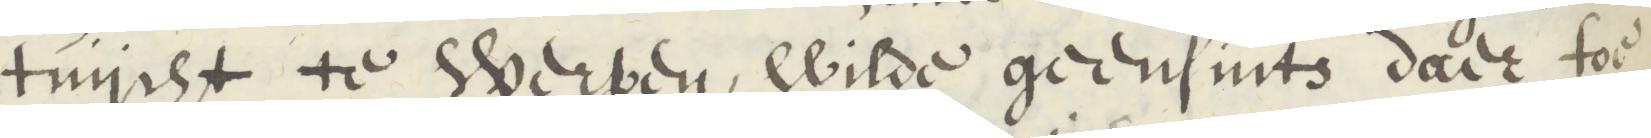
tuijcht te werpen, wilde geensints daer toe
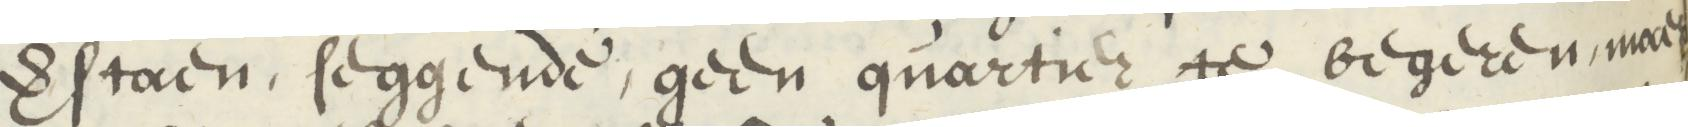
verstaen, seggende, geen quartier te begeren, maer
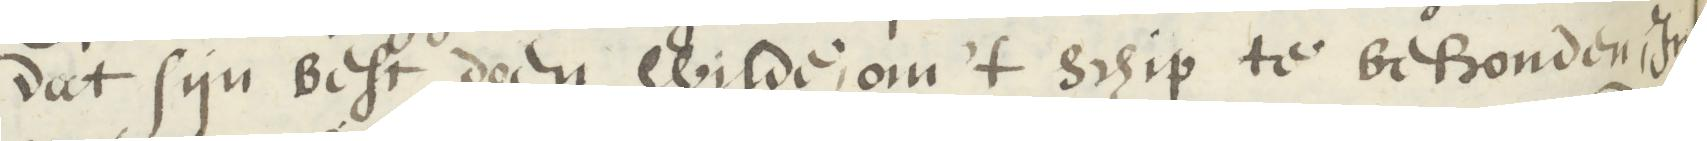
dat sijn best doen wilde, om ’t schip te behouden, Jn
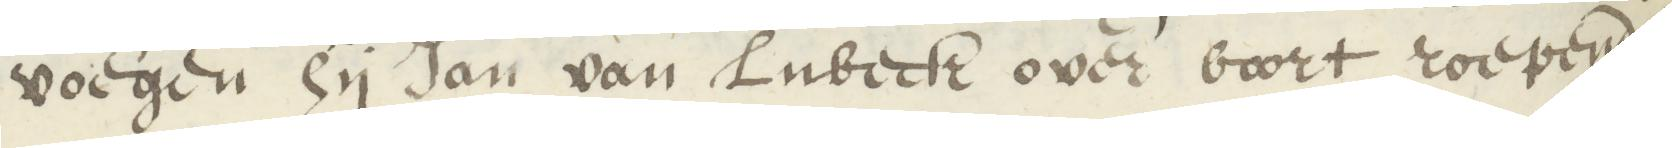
voegen hij Jan van Lubeck over boort roepende
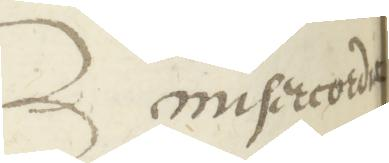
misercorde
